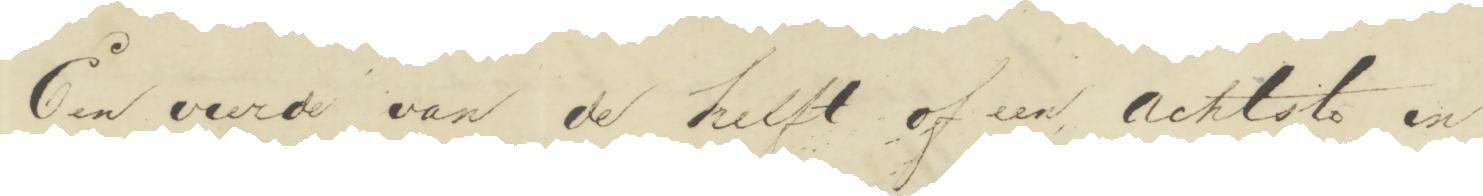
Een vierde van de helft of een achtste in
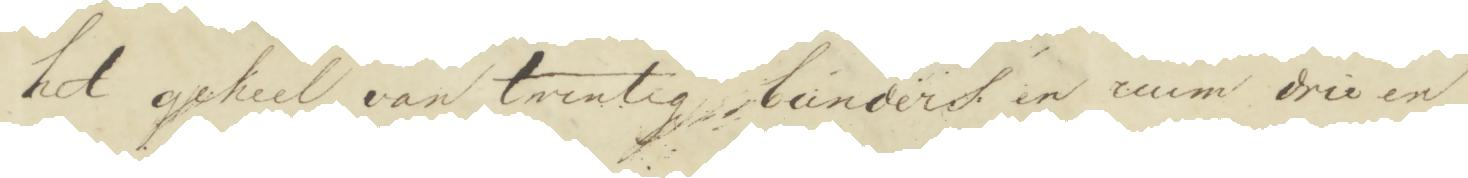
het geheel van twintig bunders en ruim drie en
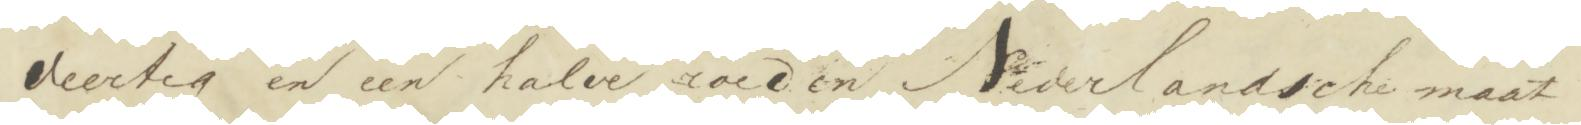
veertig en een halve roeden Nederlandsche maat
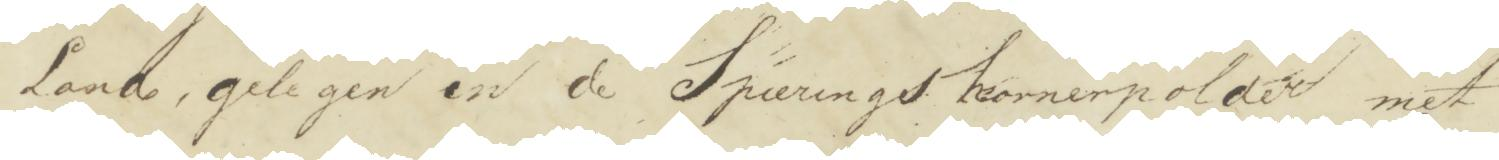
Land, gelegen in de Spierings hornerpolder met
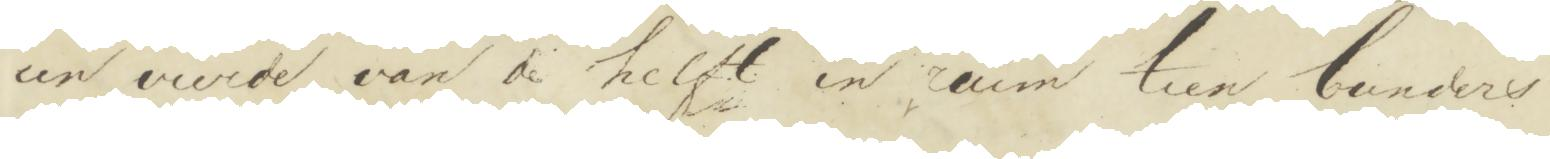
een vierde van de helft in ruim tien bunders
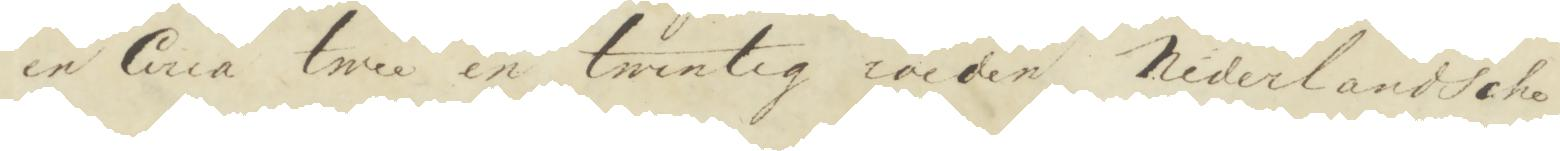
en Circa twee en twintig roeden Nederlandsche
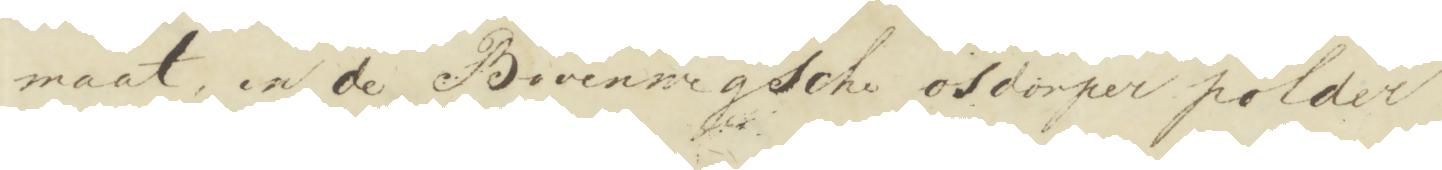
maat, in de Bovenwegsche osdorper polder
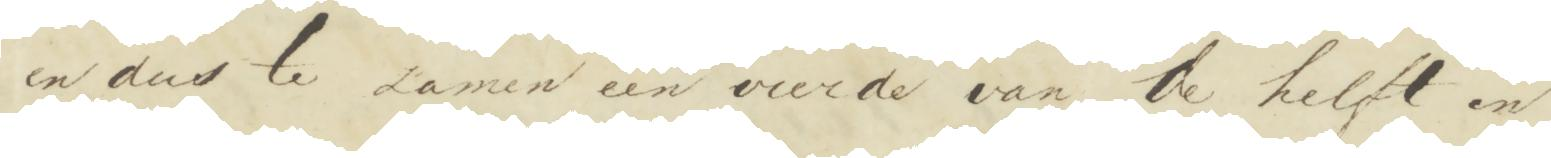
en dus te zamen een vierde van de helft in
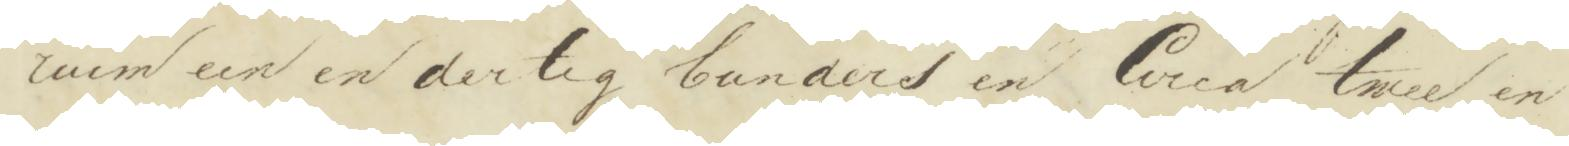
ruim een en dertig bunders en Circa twee en
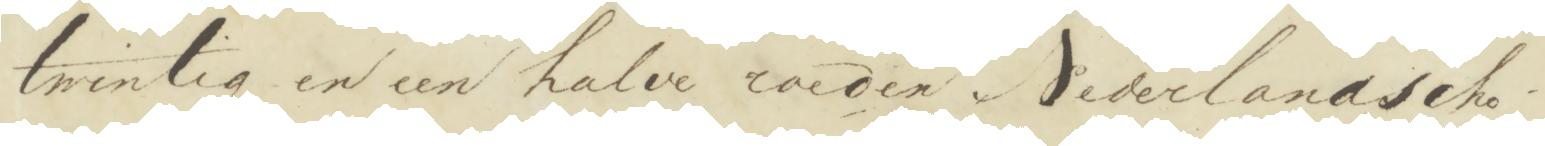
twintig en een halve roeden Nederlandsche
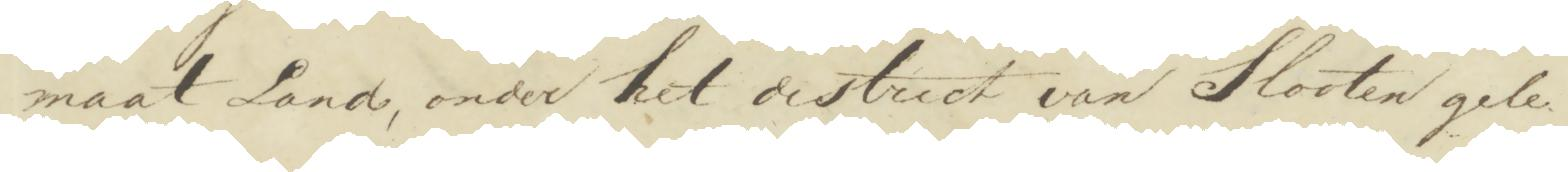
maat Land, onder het district van Slooten gele
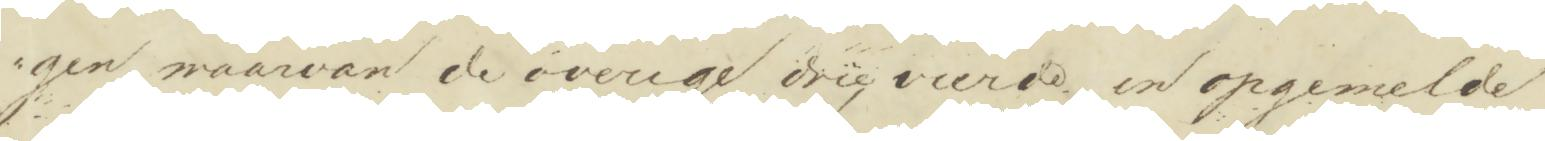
„gen, waarvan de overige drie vierde, in opgemelde
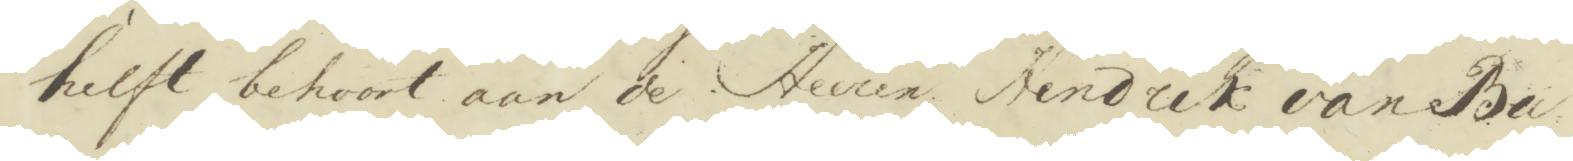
helft behoort aan de Heeren Hendrik van Ba
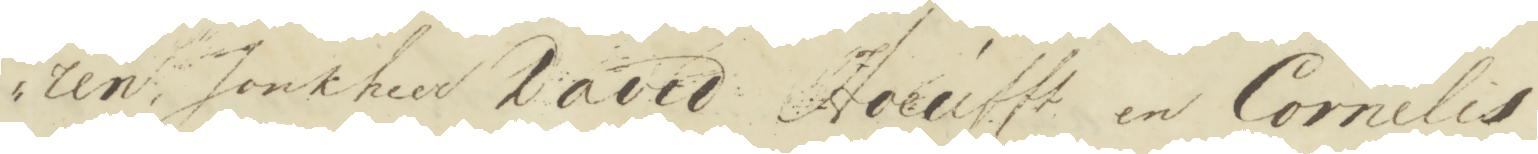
„ren, Jonkheer David Hoeufft en Cornelis
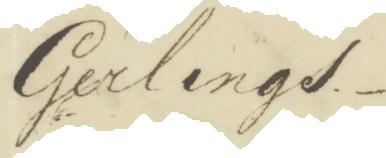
Gerlings.
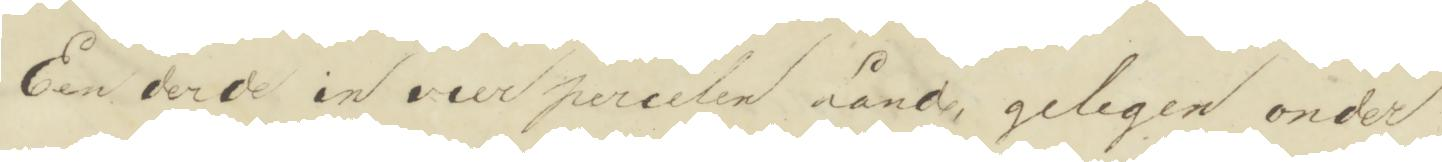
Een derde in vier percelen Land, gelegen onder
